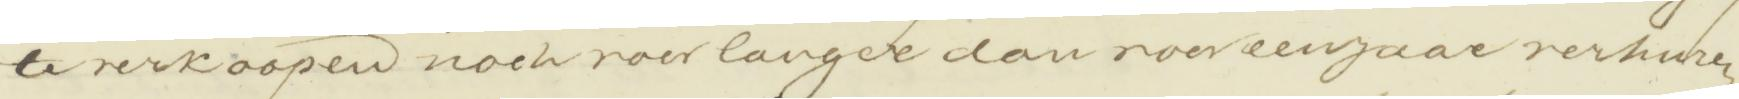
te verkoopen noch voor langer dan voor een jaar verhuren
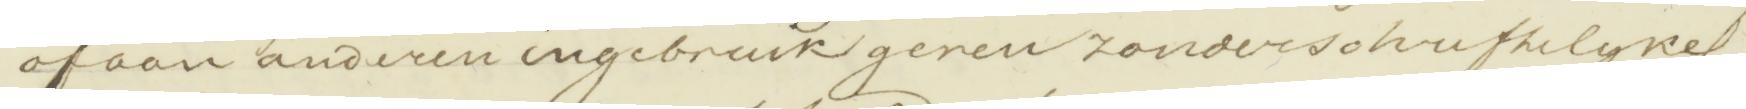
of aan anderen ingebruik geven zonderschriftelyke
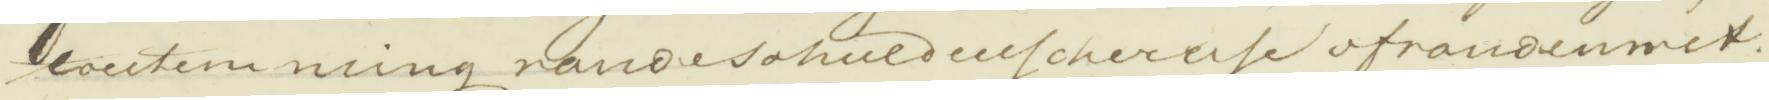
toectemming vandeschuldeischeresse ofvandenwet.
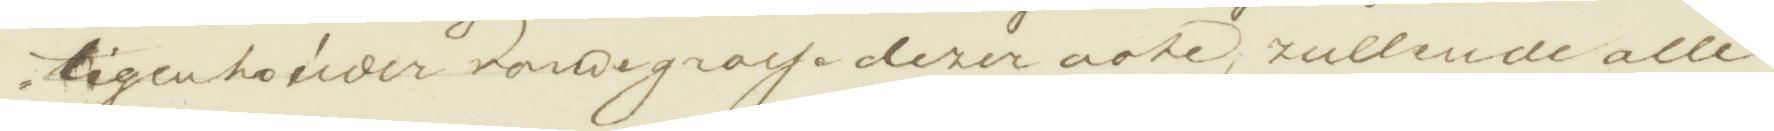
„tigenhouder vande grosse dezer acte, zullende alle
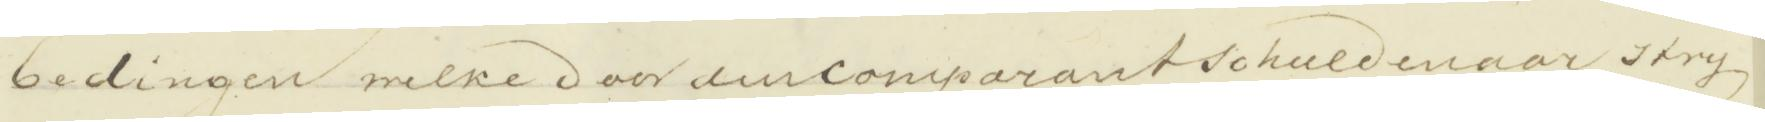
bedingen welke door dencomparantschuldenaar, stry
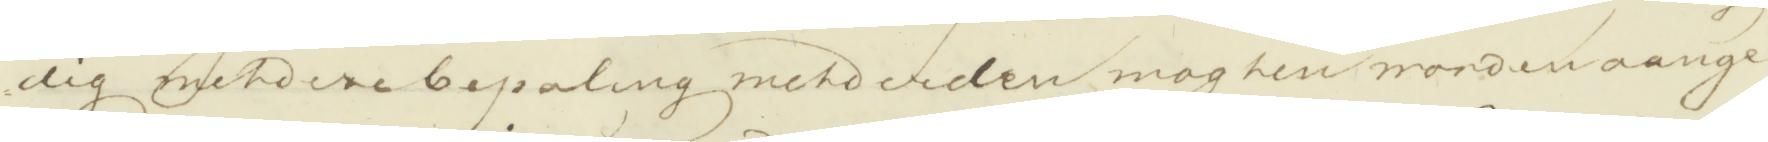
„dig metdeze bepaling metderden mogten worden aange
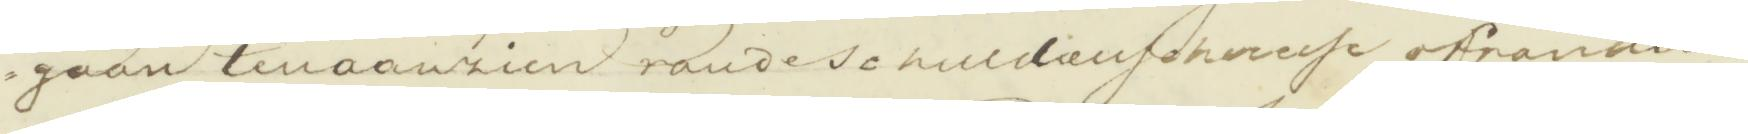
„gaan tenaanzien vandeschuldeisscheresse ofvanden
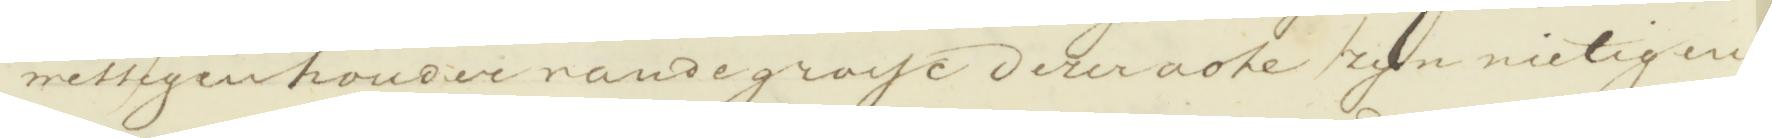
wettigenhouder vande grosse dezer acte zyn nietig en
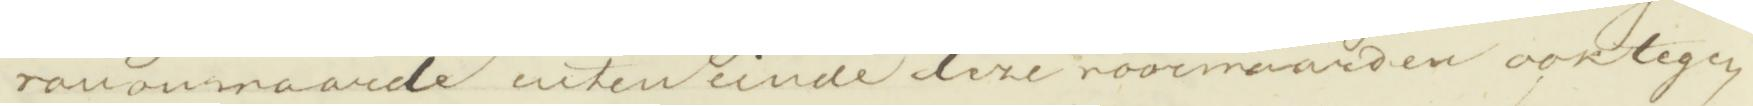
van onwaarde enten einde deze voorwaarden ooktegen
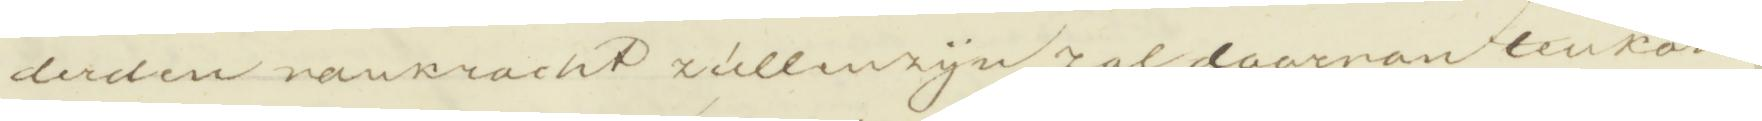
derden vankracht zullenzijn, zal daarvan tenkan,
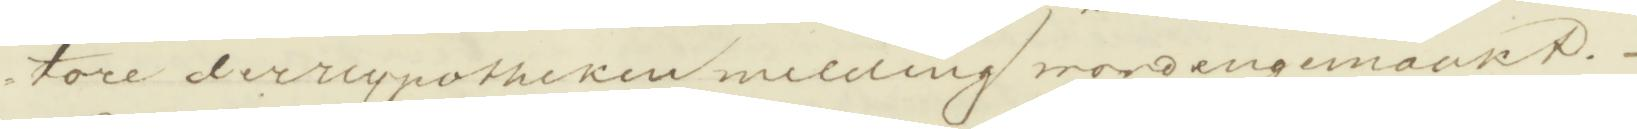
„tore derhypotheken melding wordengemaakt.
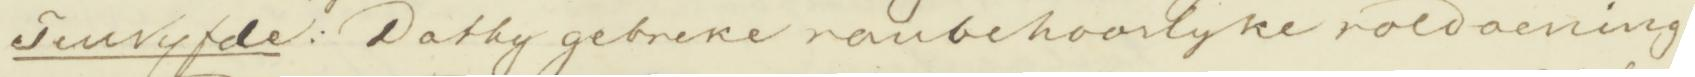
Tenvyfde : Datby gebreke vanbehoorlyke voldoening
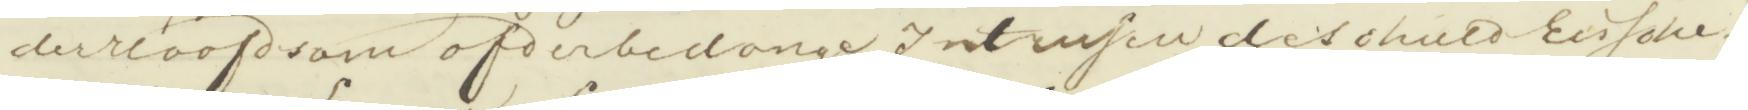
derHoofdsom ofderbedonge Intressen deschuld Eissche-
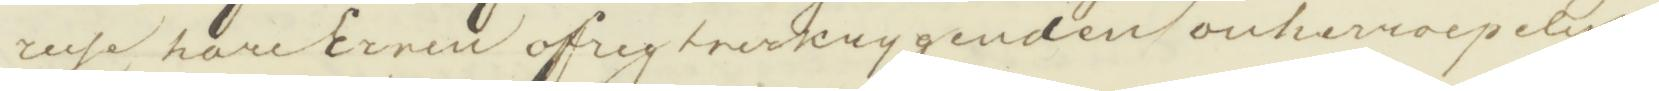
resse hare Erven ofregtverkrygenden onherroepelyk
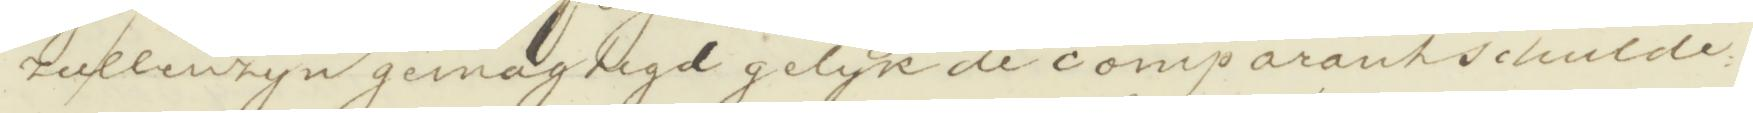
zullenzyn gemagtigd gelyk de comparantschulde„
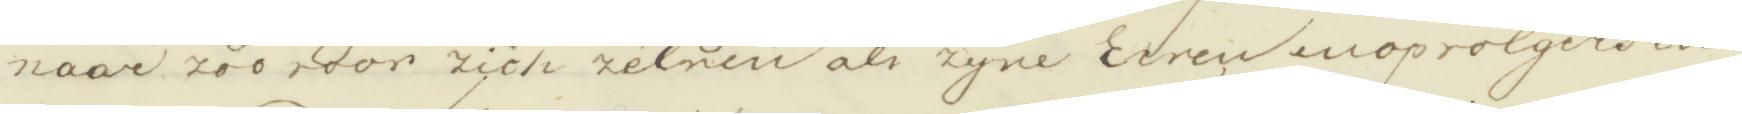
naar zoo voor zich zelven als zyne Erven enopvolgers in
